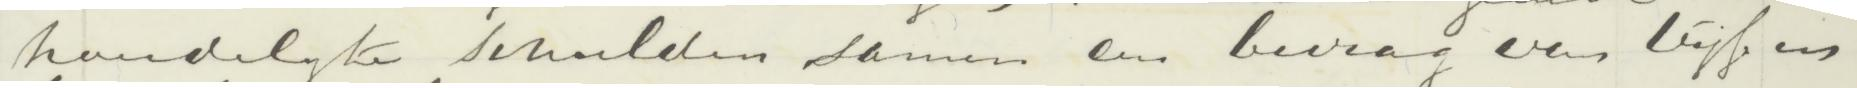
houdelyke schulden samen een bedrag van Vijf en
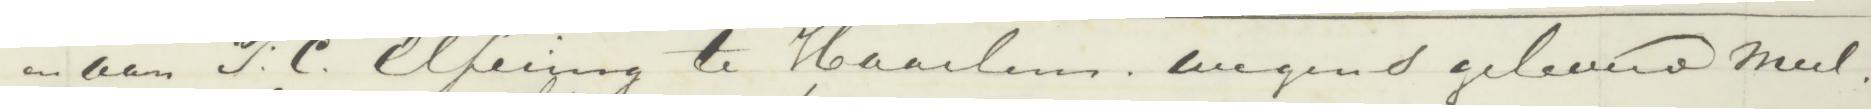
en aan T:C. Elfering te Haarlem, wegens geleverd meel
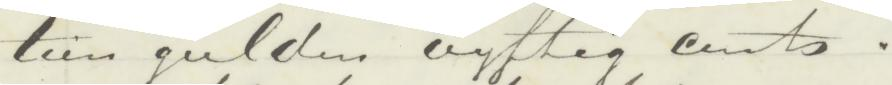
tien gulden vyftig cents.
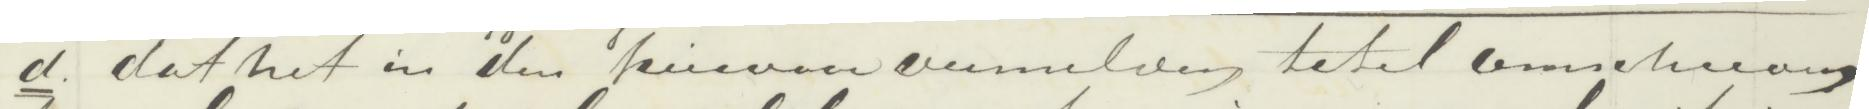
d. dat het in den hiervoor vermelden titel omschreven
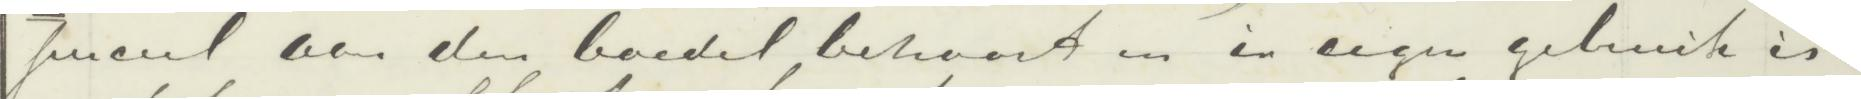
perceel aan den boedel behoort en in eigen gebruik is
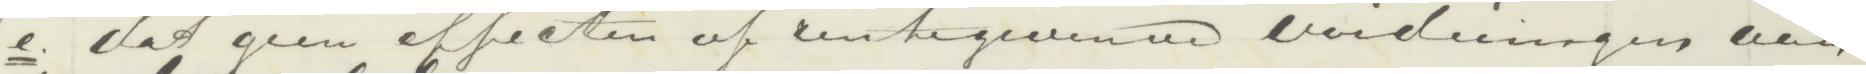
e. dat geen effecten of rentegevende vorderingen aan
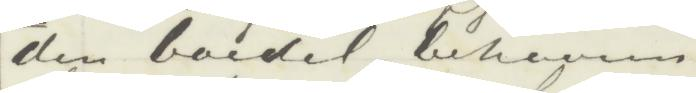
den boedel behooren
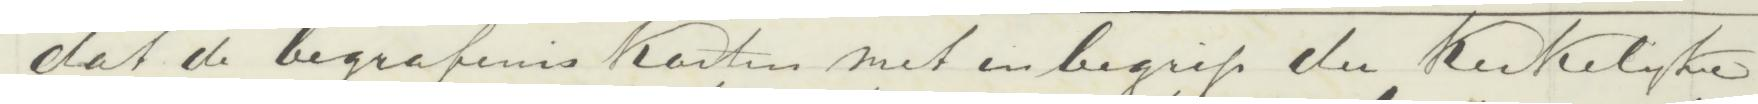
dat de begrafenis kosten met in begrip der kerkelyke
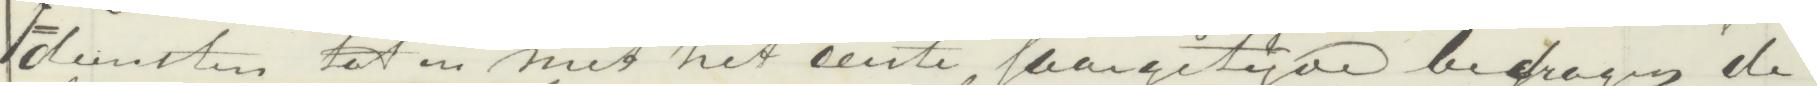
diensten tot en met het eerste jaargetyde bedragen de
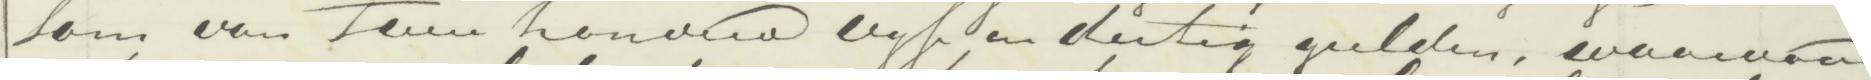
som van Twee honderd vyf en dertig gulden, waarvoor
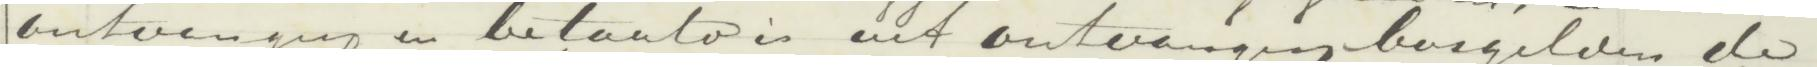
ontvangen en betaald is uit ontvangen bosgelden de
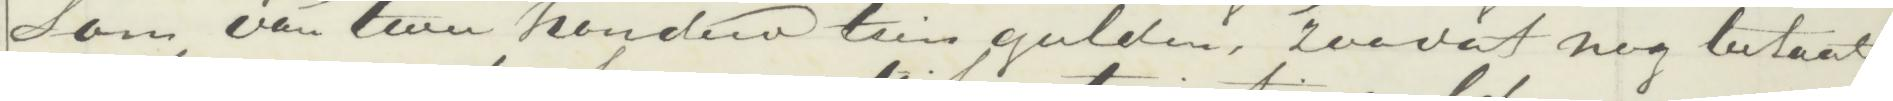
som van twee honderd tien gulden, zoodat nog betaald
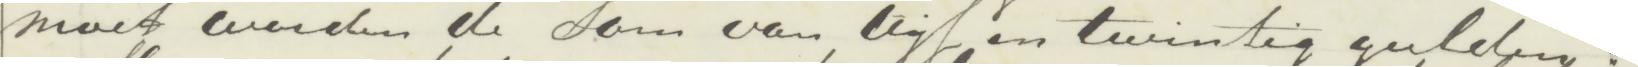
moet worden de som van Vijf en twintig gulden.-
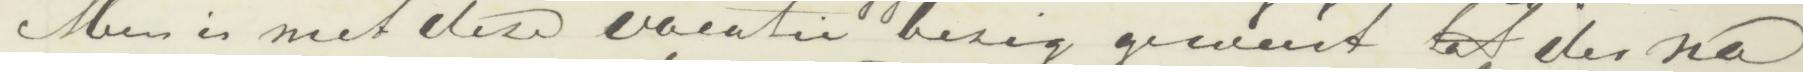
Men is met deze vocatie bezig geweest tot des na
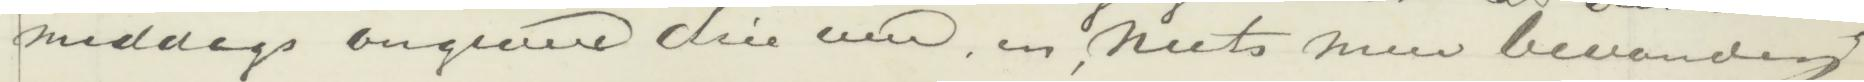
middags ongeveer drie uren, en, niets meer bevonden
